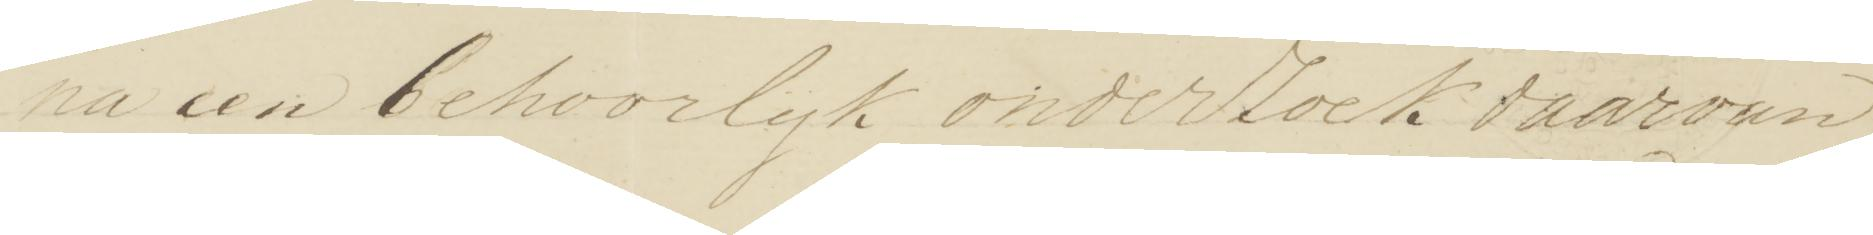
na een behoorlijk onderzoek daarvan
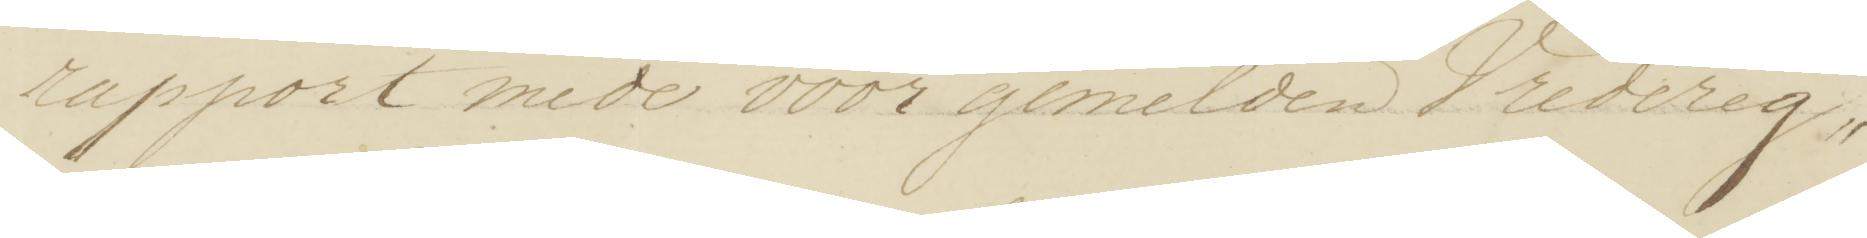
rapport mede voor gemelden Vredereg„
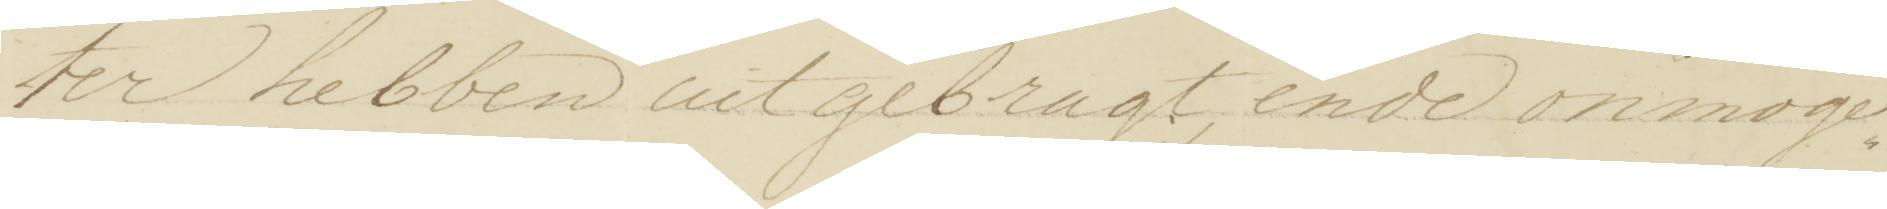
ter hebben uitgebragt, ende onmoge„
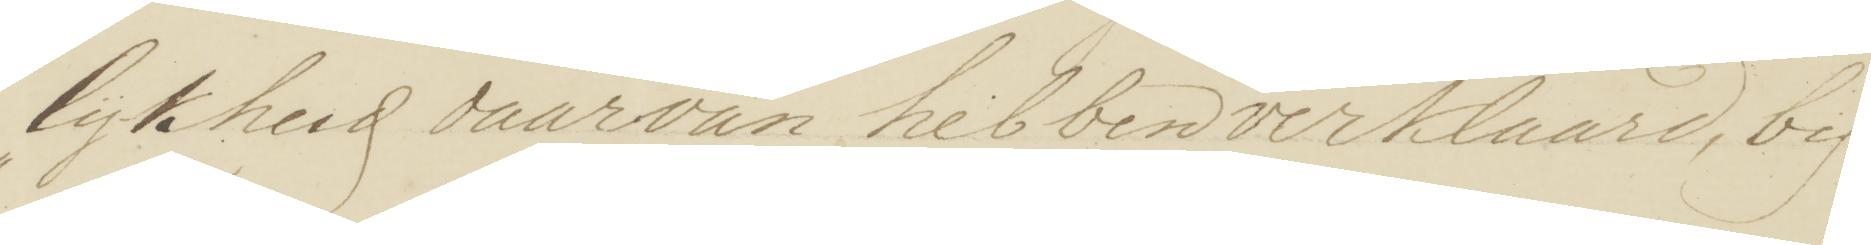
„lijkheid daarvan hebben verklaard, bij
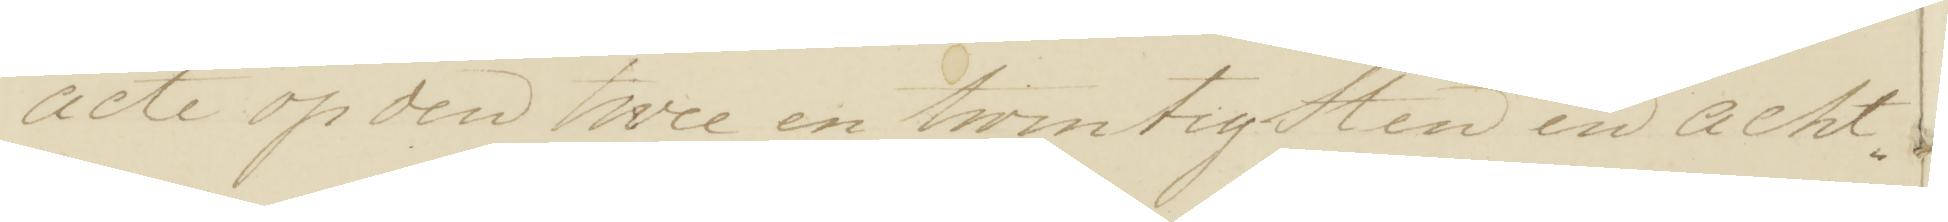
acte op den twee en twintigsten en acht=
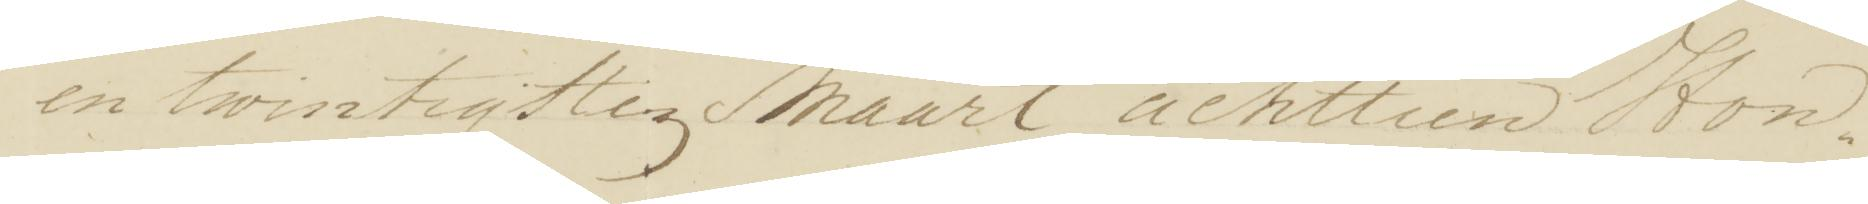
en twintigsten Maart achttien Hon„
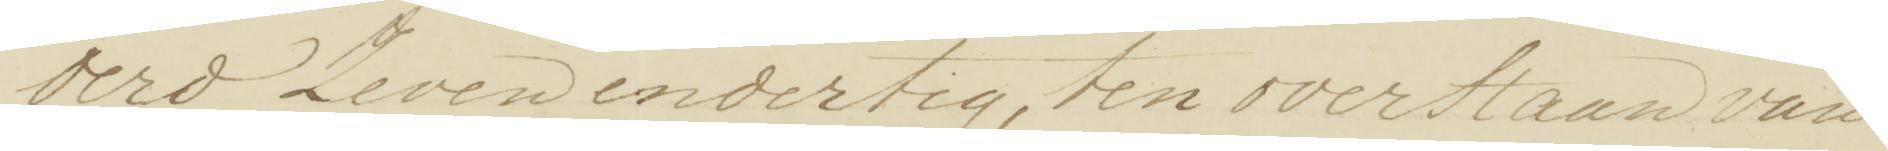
derd Zeven en dertig, ten overstaan van
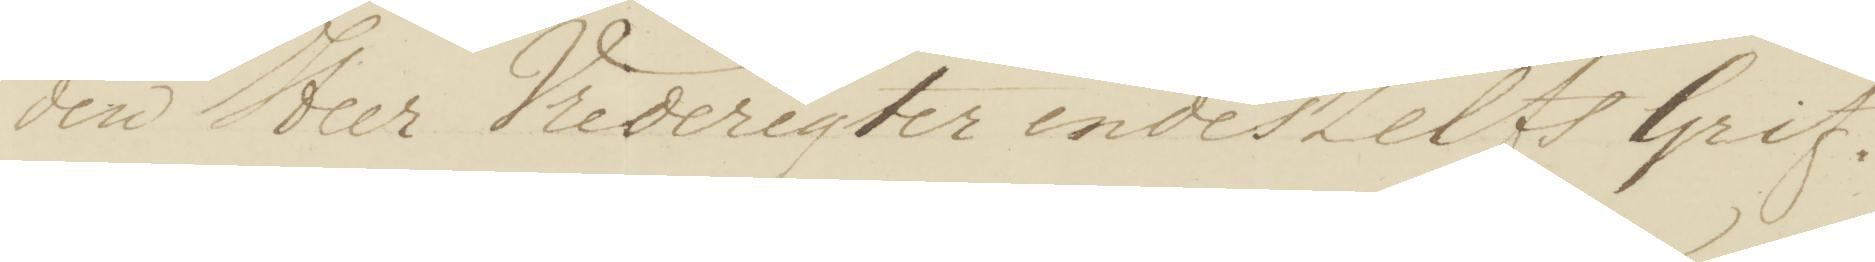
den Heer Vrederegter en deszelfs Grif.
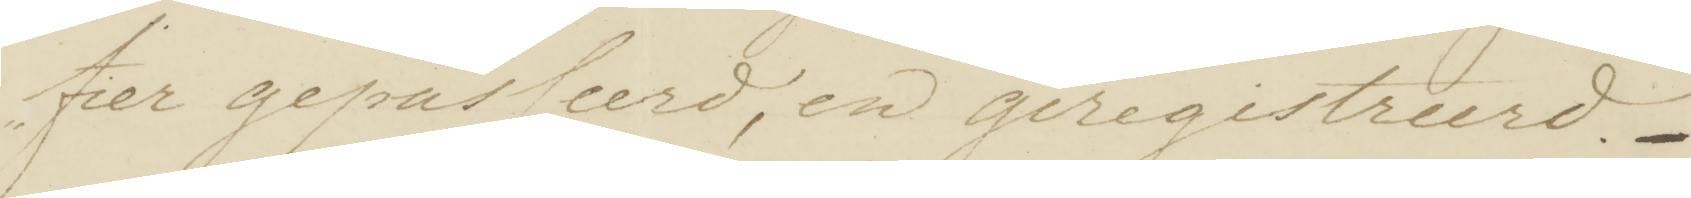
„fier gepasseerd, en geregistreerd.—
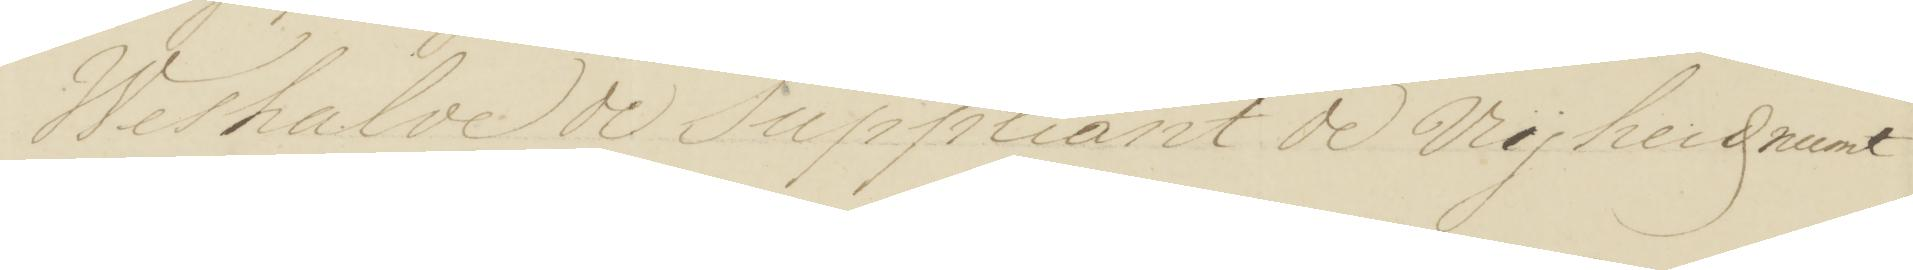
Weshalve de Suppliant de Vrijheid neemt
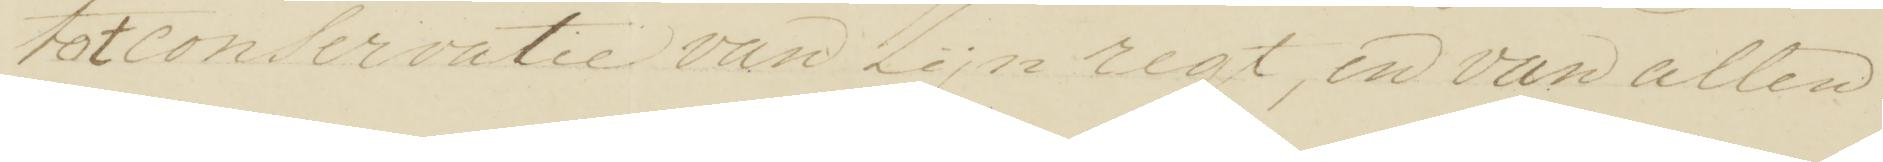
tot conservatie van Zijn regt, en van allen
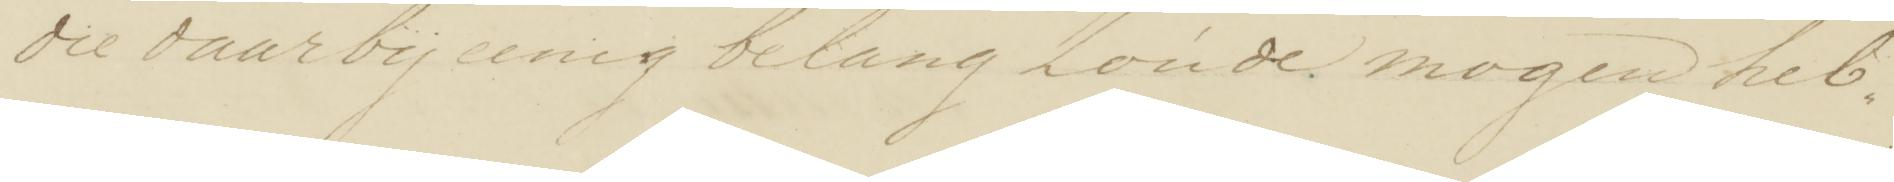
die daarbij eenig belang Zoude mogen heb„
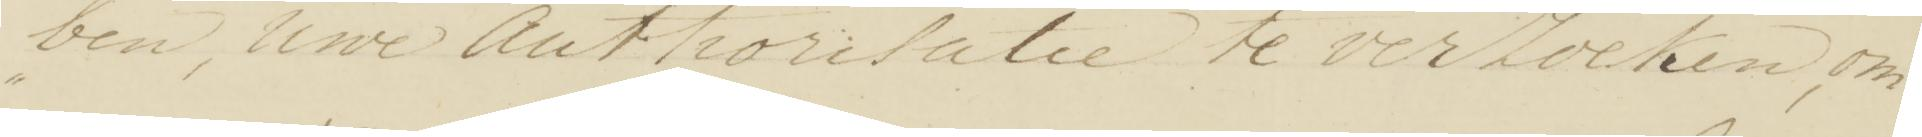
„ben, uwe Authorisatie te verzoeken, om
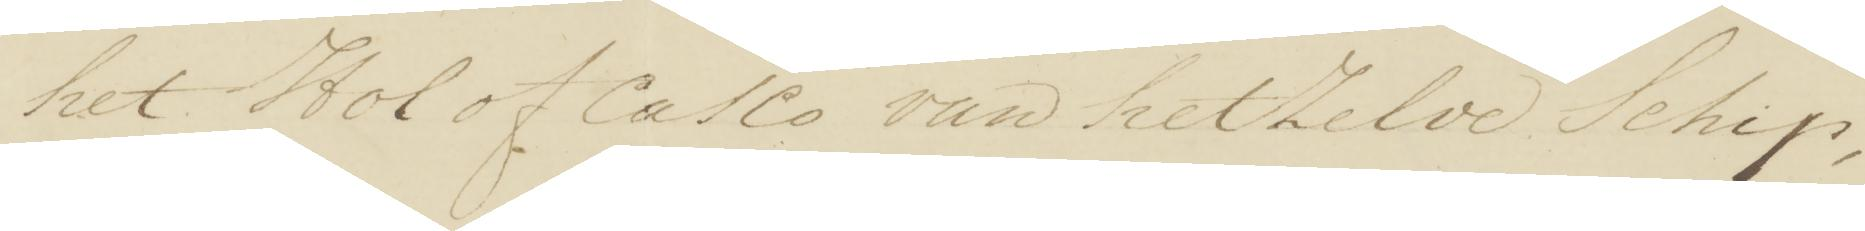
het Hol of casco van hetzelve Schip,
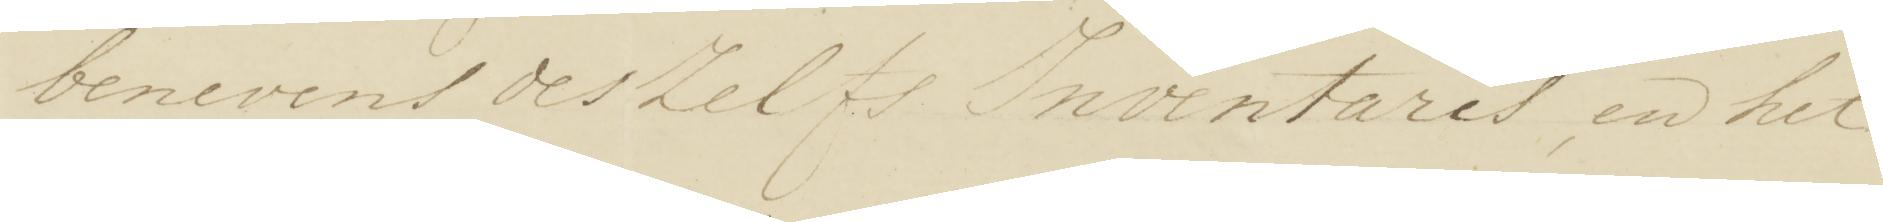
benevens deszelfs Inventaris, en het
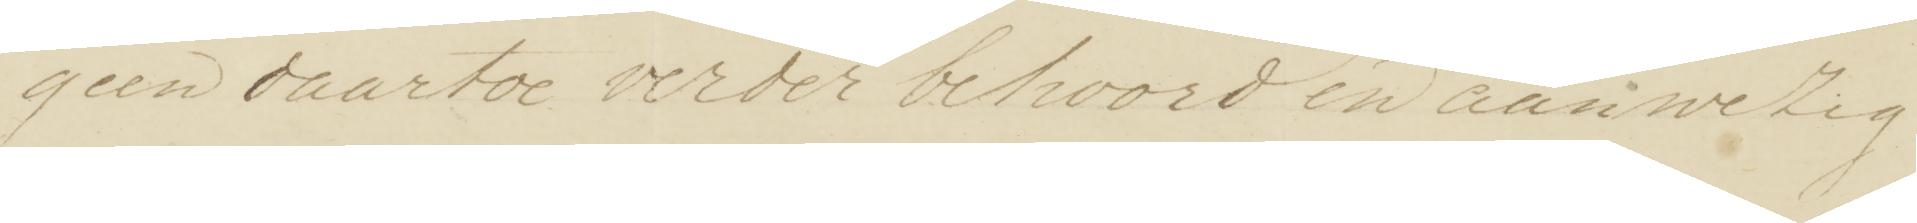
geen daartoe verder behoord en aanwezig
